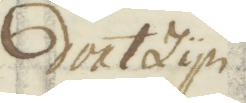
dort zijn
